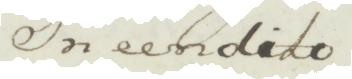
In een dito
